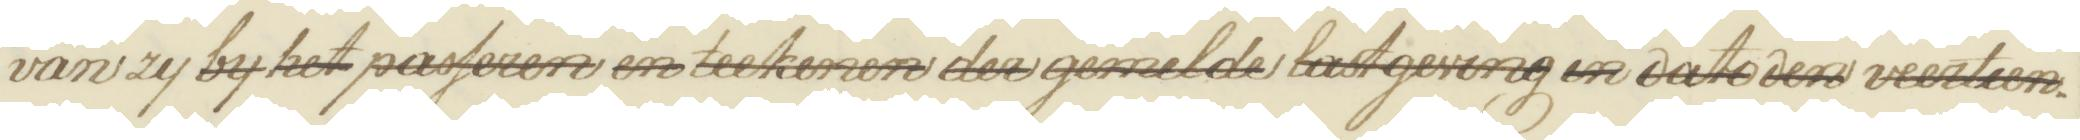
van zy by het passeren en teekenen der gemelde lastgeving in dato den veertien.
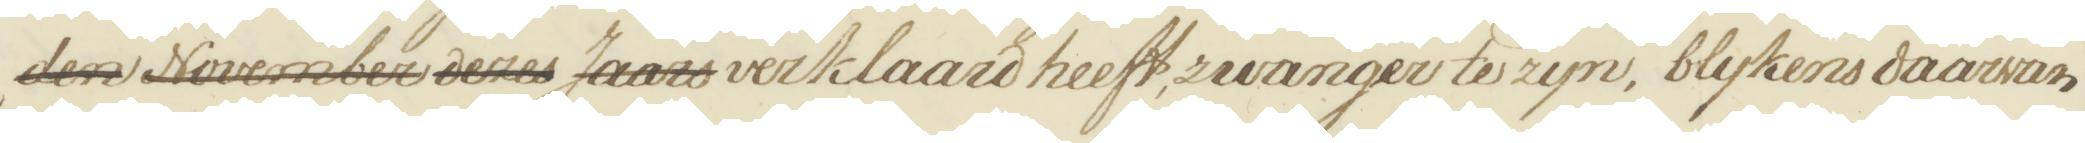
den November dezes Jaars verklaard heeft, zwanger te zyn, blykens daarvan
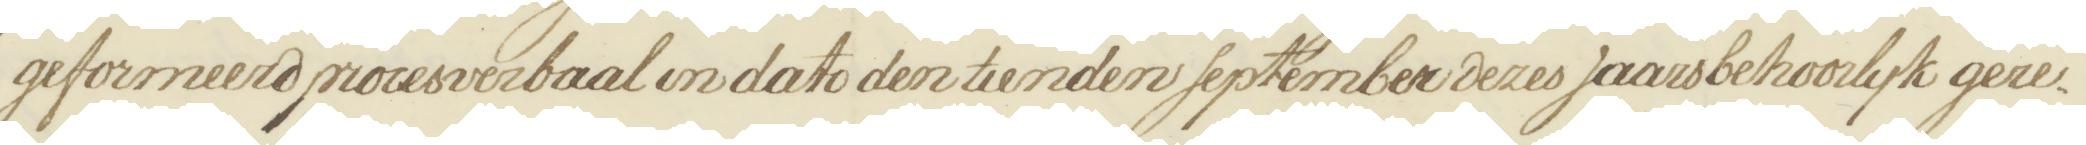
geformeerd procesverbaal in dato den tienden September dezes Jaars behoorlyk gere„
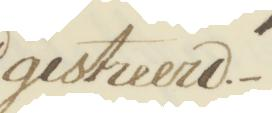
gestreerd.—
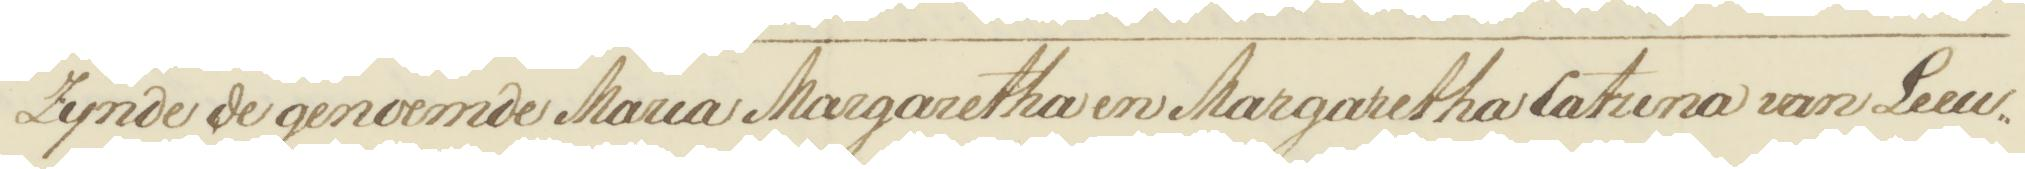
Zynde de genoemde Maria Margaretha en Margaretha Catrina van Leeu„
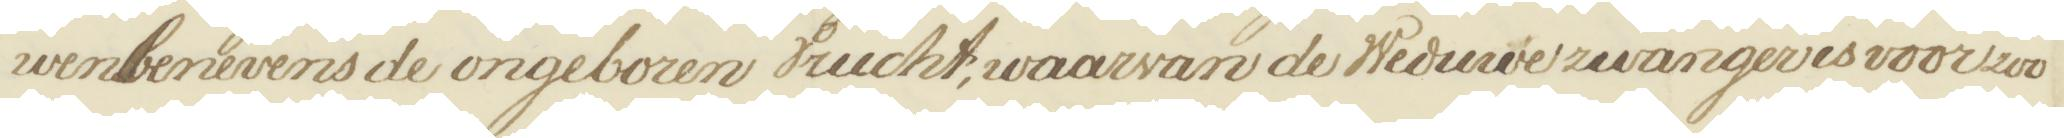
wen benevens de ongeboren Vrucht, waarvan de weduwe zwanger is voor zoo
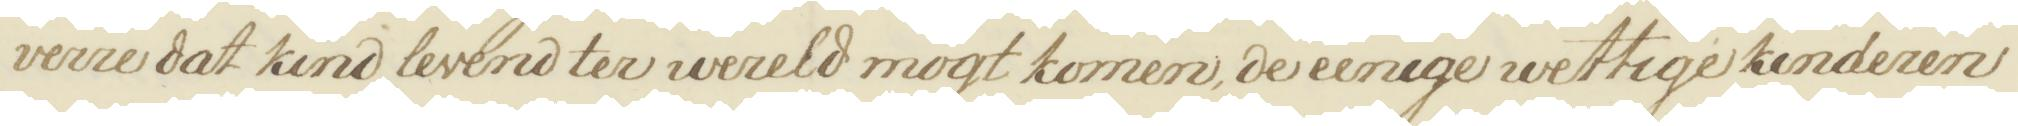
verre dat kind levend ter wereld mogt komen, de eenige wettige kinderen
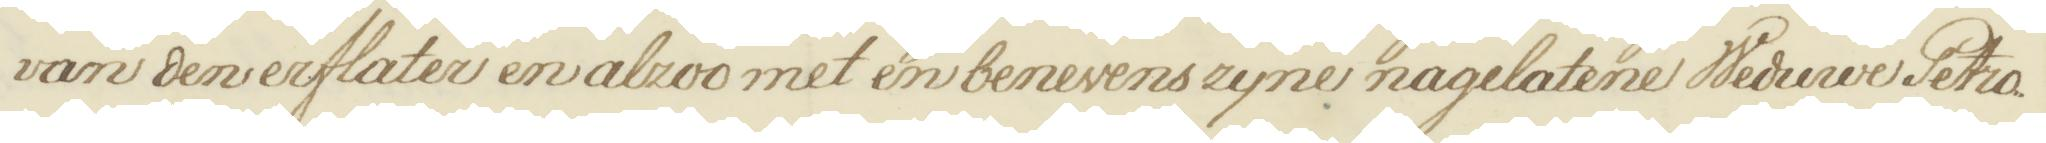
van den erflater en alzoo met en benevens zyne nagelatene weduwe Petro
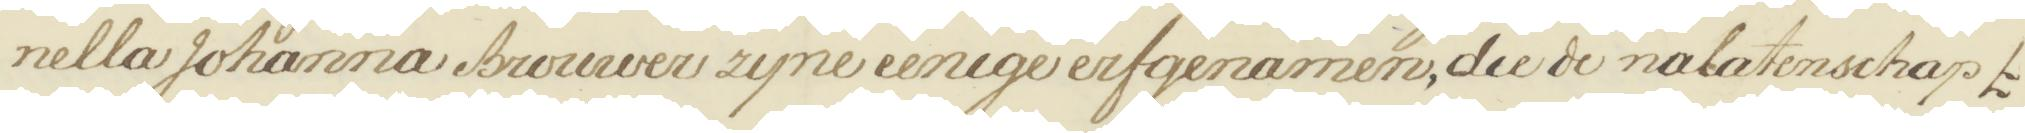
nella Johanna Brouwer zyne eenige erfgenamen, die de nalatenschap ¶
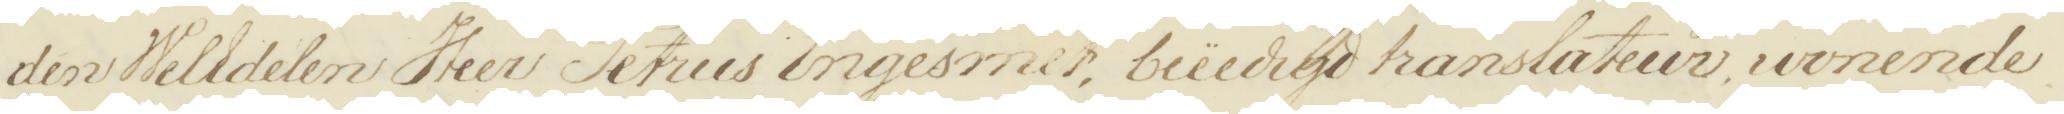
den WelEdelen Heer Petrus Engesmet, beëedigd translateur, wonende
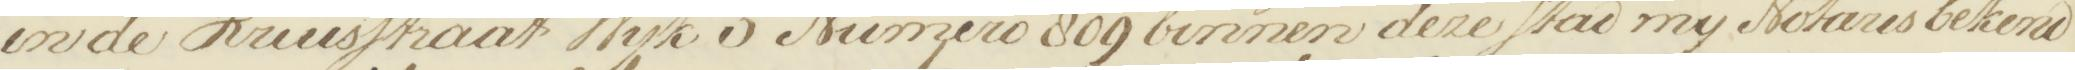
in de Kruisstraat Wyk 5 Numero 809 binnen deze stad my Notaris bekend
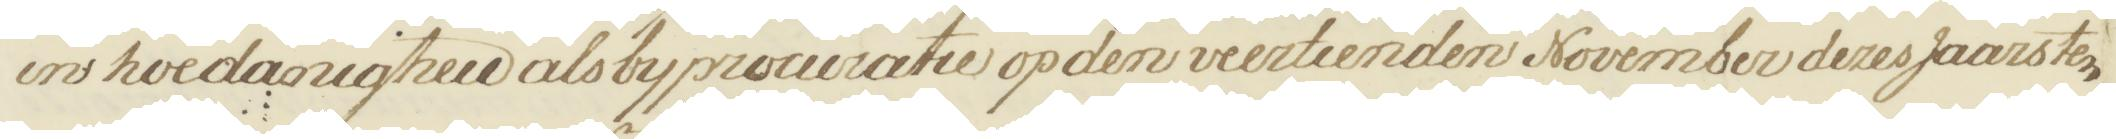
in hoedanigheid als by procuratie op den veertienden November dezes Jaars ten
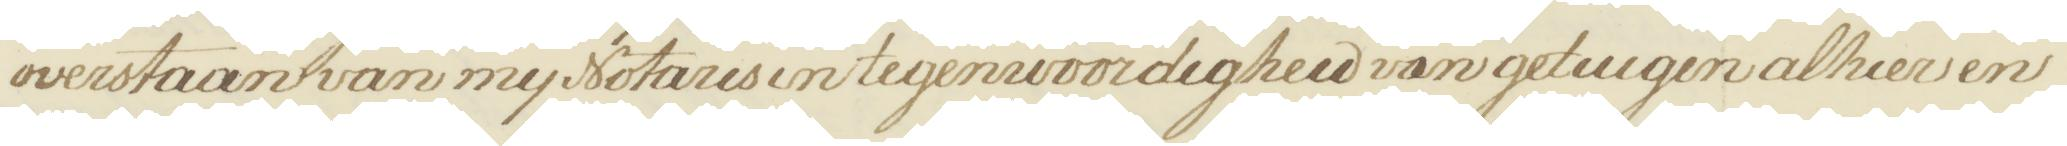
overstaan van my Notaris in tegenwoordigheid van getuigen alhier en
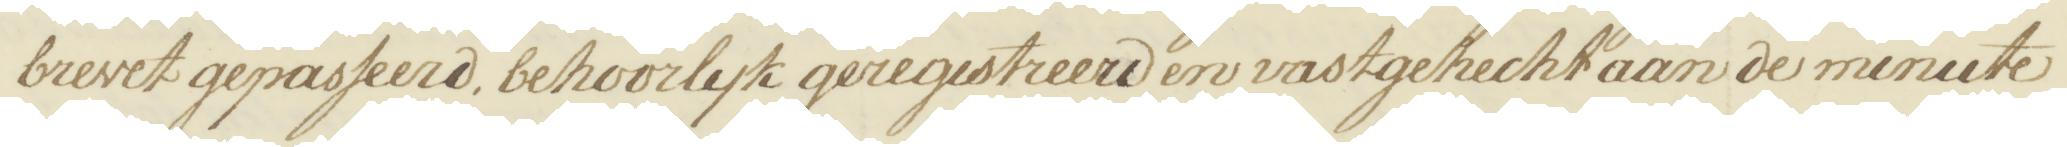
brevet gepasseerd, behoorlyk geregistreerd en vastgehecht aan de minute
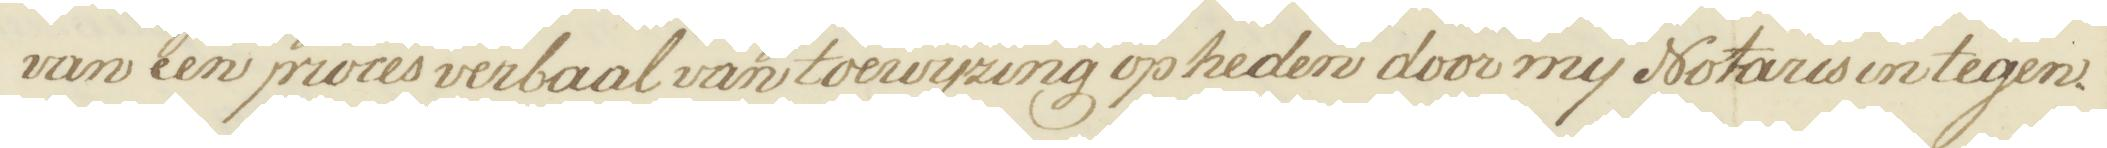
van Een proces verbaal van toewyzing opheden door my Notaris in tegen.
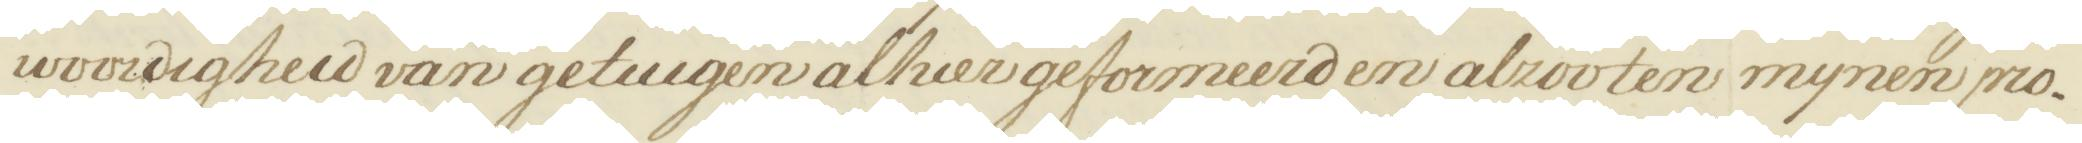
woordigheid van getuigen alhier geformeerd en alzoo ten mynen pro„
